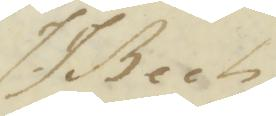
J. J Bech
